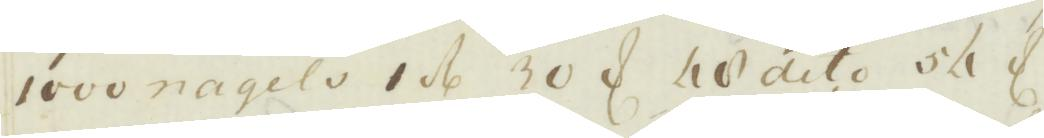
1000 nagels 1A 30 st 48 dito 54 st
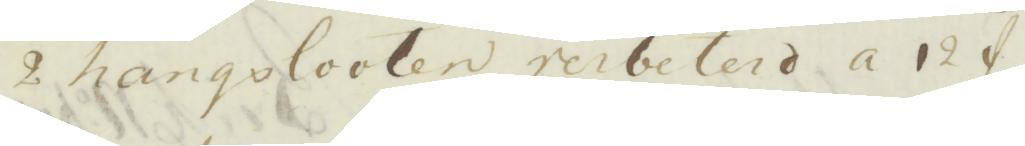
2 hangslooten verbeterd a 12 ver
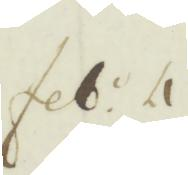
feb.i 4
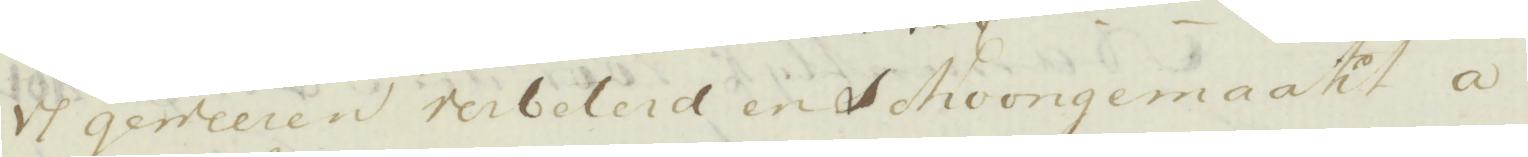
17 geweeren verbeterd en schoongemaakt a
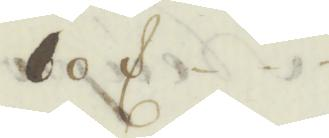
60 st
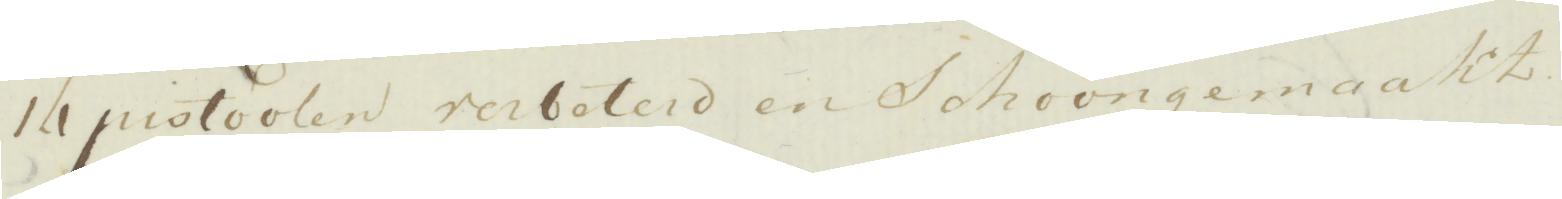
14 pistoolen verbeterd en schoongemaakt.
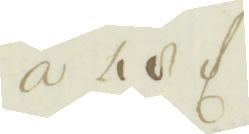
a 48 st
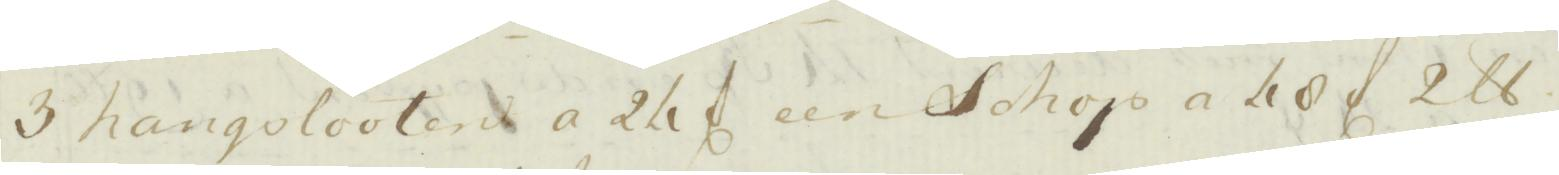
3 hangslooten a 24 st een schop a 48 st 2 lb.
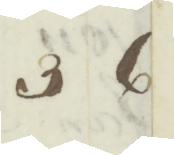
3 6
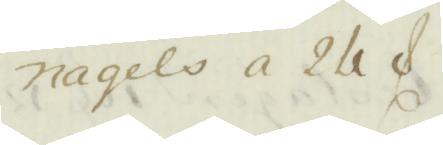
nagels a 24 st
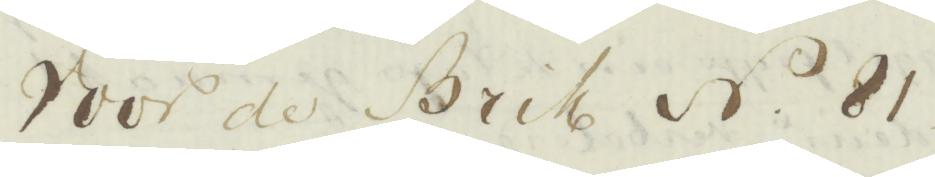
Voor de Brik N. 81
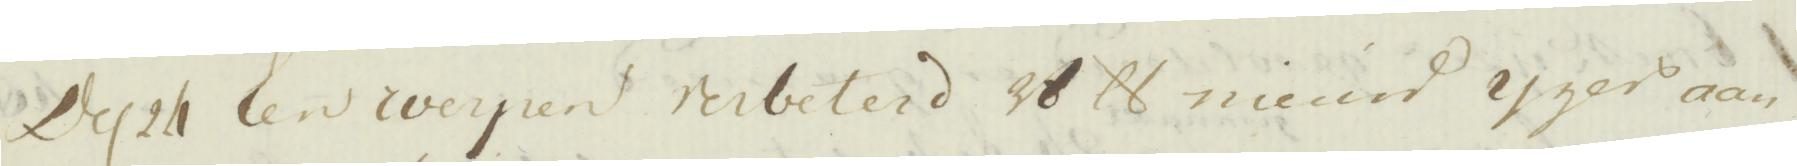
Dec 24 Een roerpen verbeterd 38 lb nieuw Yzer aan
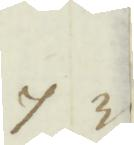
7 3
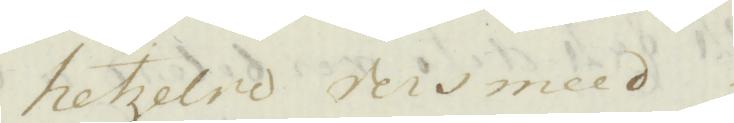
hetzelve versmeed
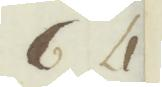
6 4
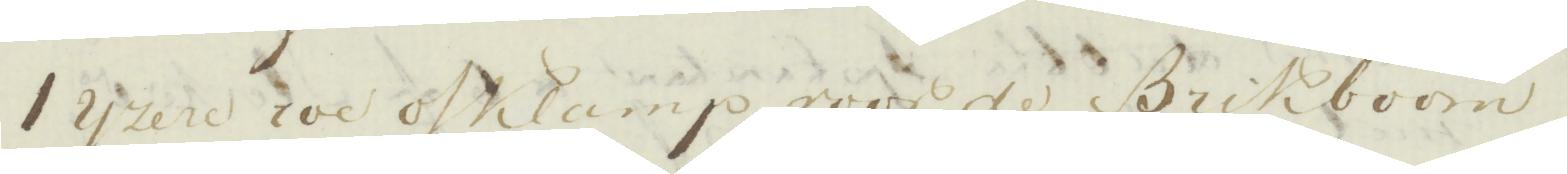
1 yzere roe of Klamp voor de Brikboom
